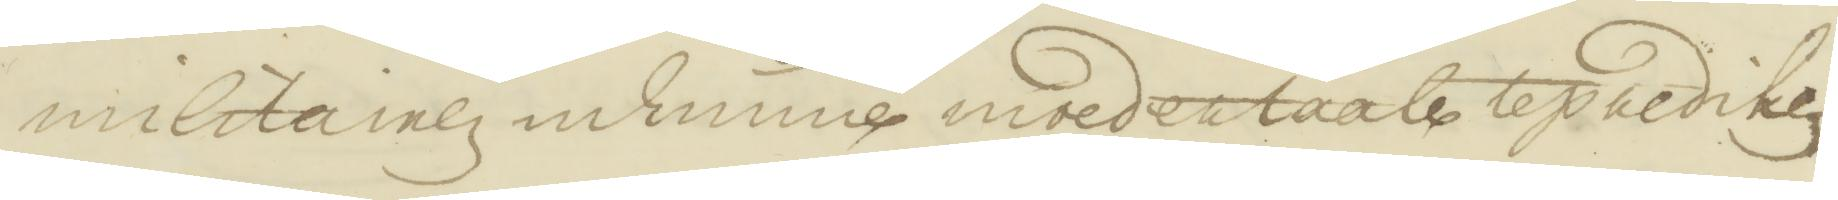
militairen inhunne moedertaale te prediken
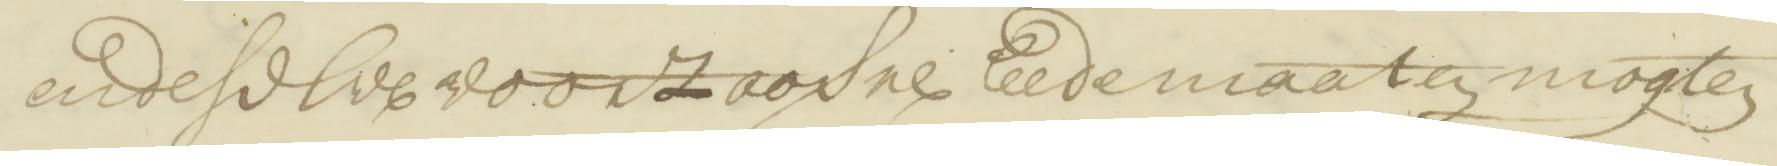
en deselve voor zooverre leedemaaten mogten
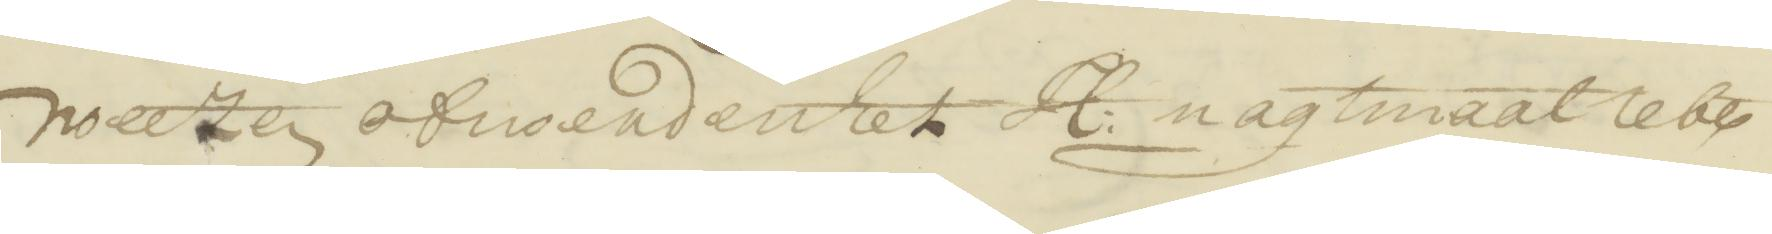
weezen afwerden het H: nagtmaal te be
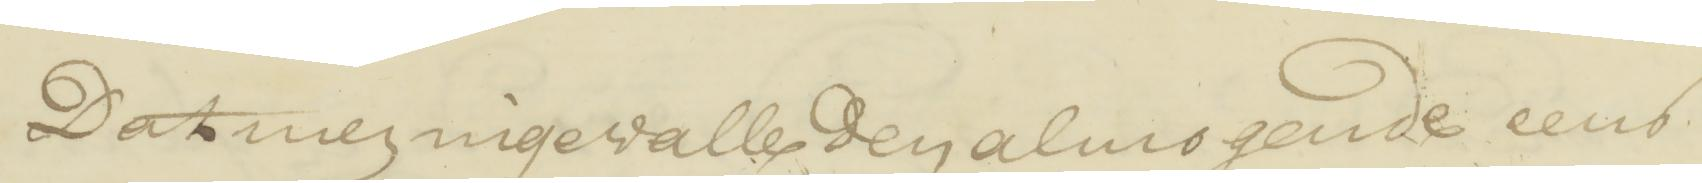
Dat men ingevalle den almogende eens
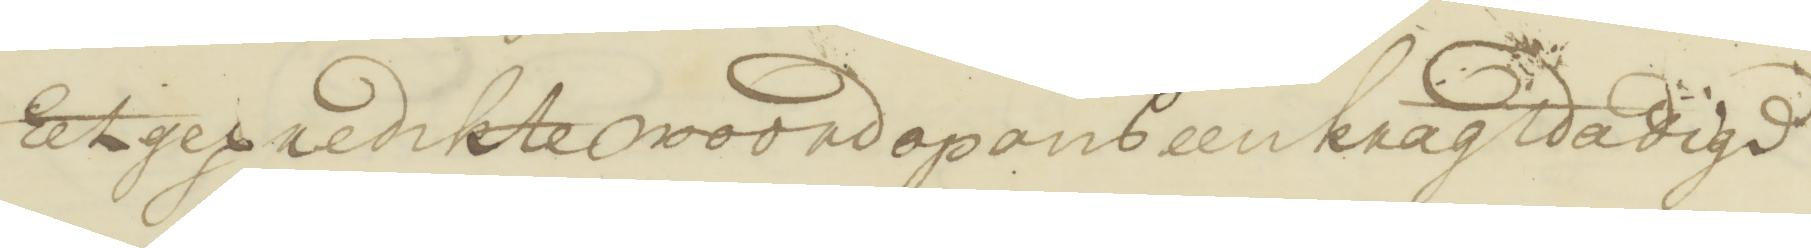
het gepredikte woord op ons een kragtdadige
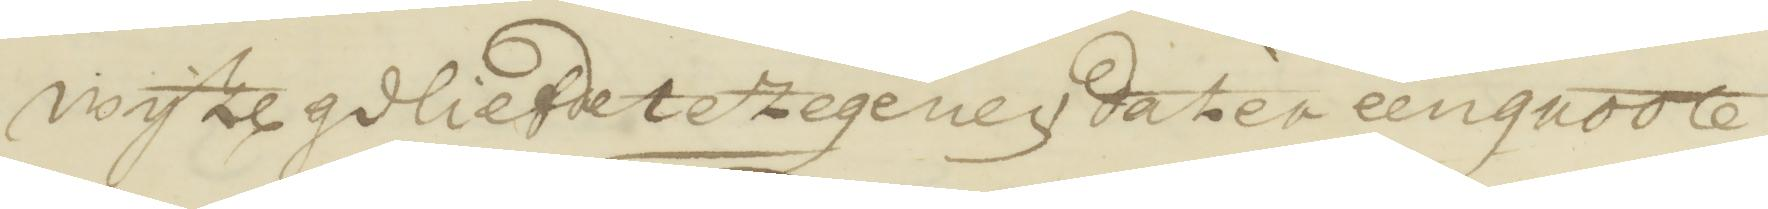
wijze geliefde te zegenen dat'er een groote
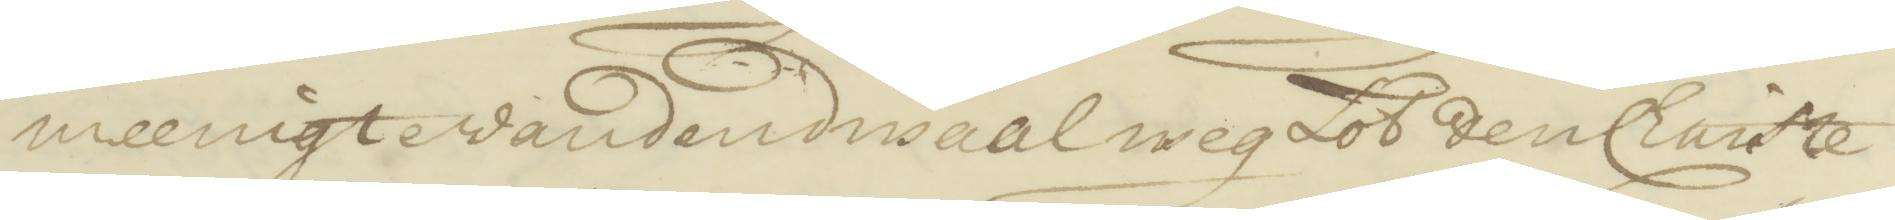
meenigte vanden dwaalweg tot den Christe
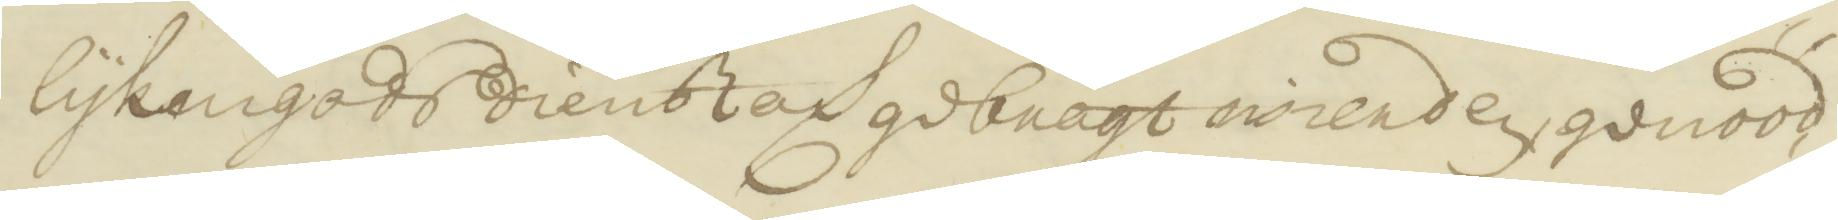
lijken godsdienst overgebragt wierden, genood
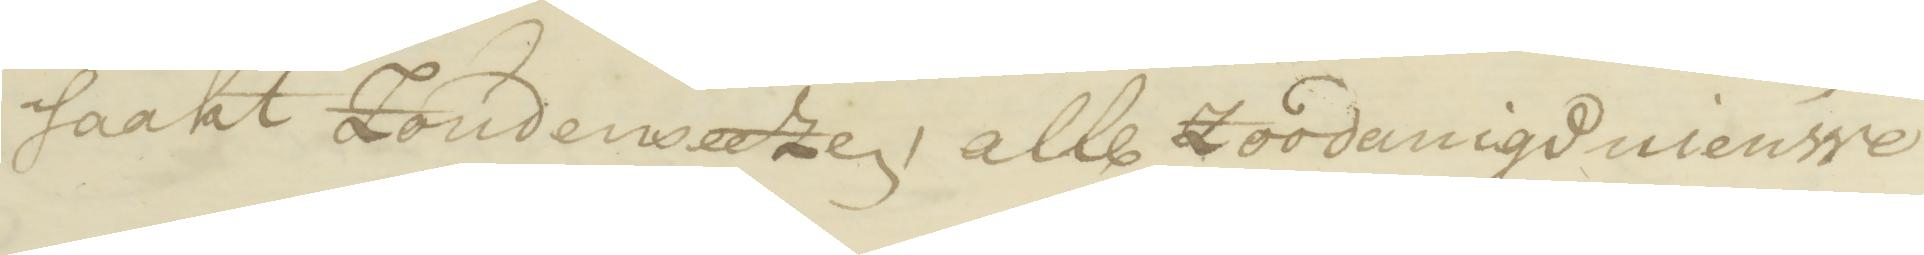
saakt zoude weezen, alle zoodanige nieuwe
